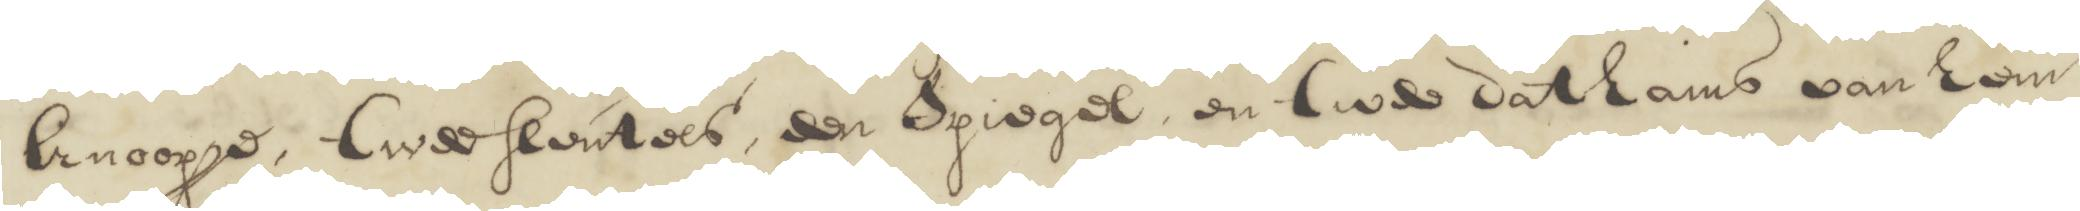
knoopje, tweesleutels, een Spiegel en twee dathams van hem
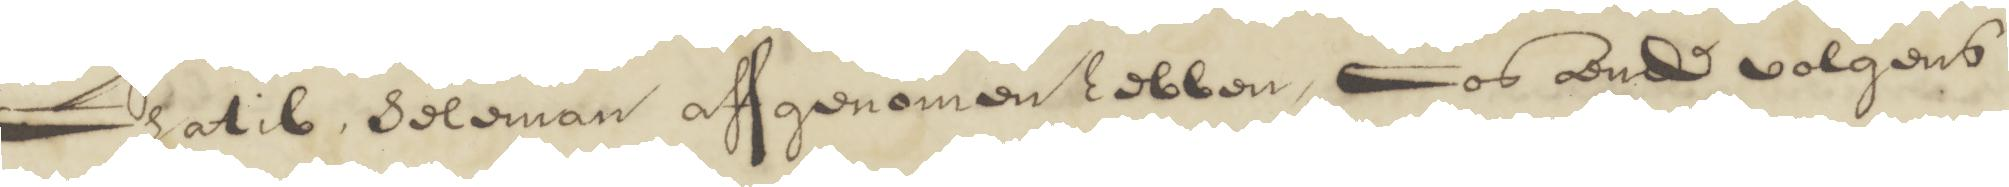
Chatib, seleman affgenomen hebben, Costende volgens
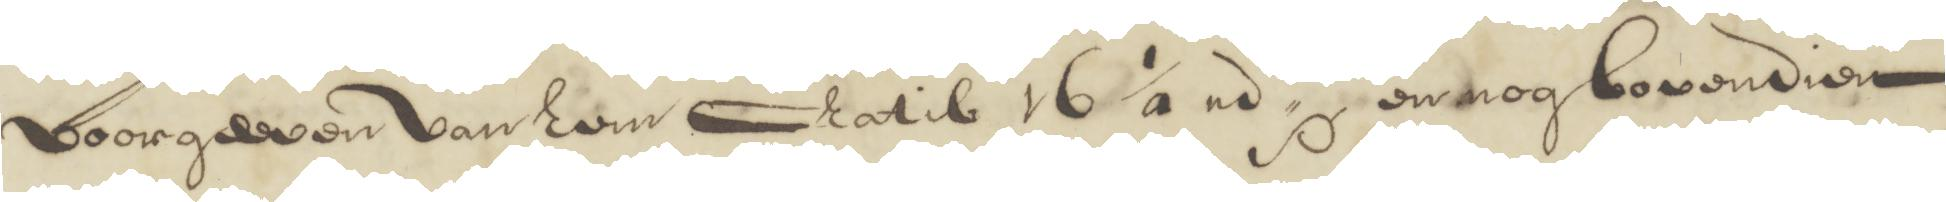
voorgeeven van hem Chatib 16 ¼ rd„S , en nog bovendien
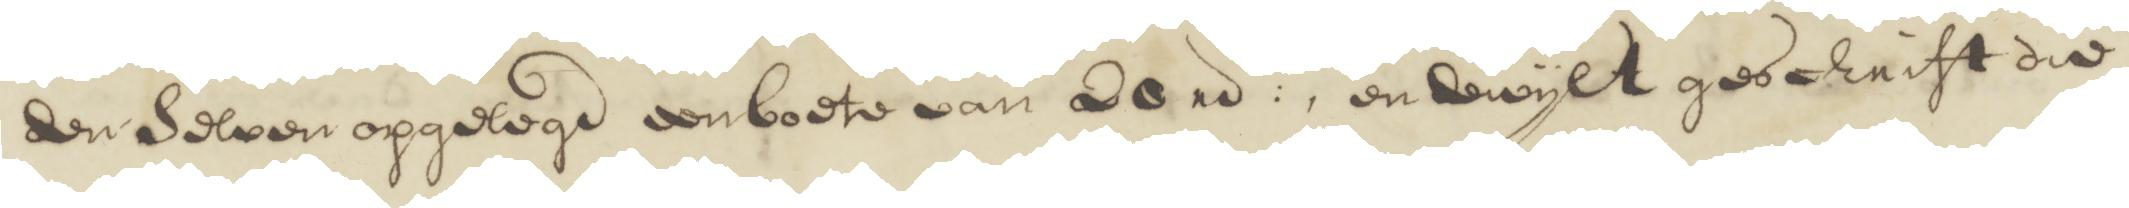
denselven opgelegd eenboete van 20 rd:S , en dewijl't geschrift die
